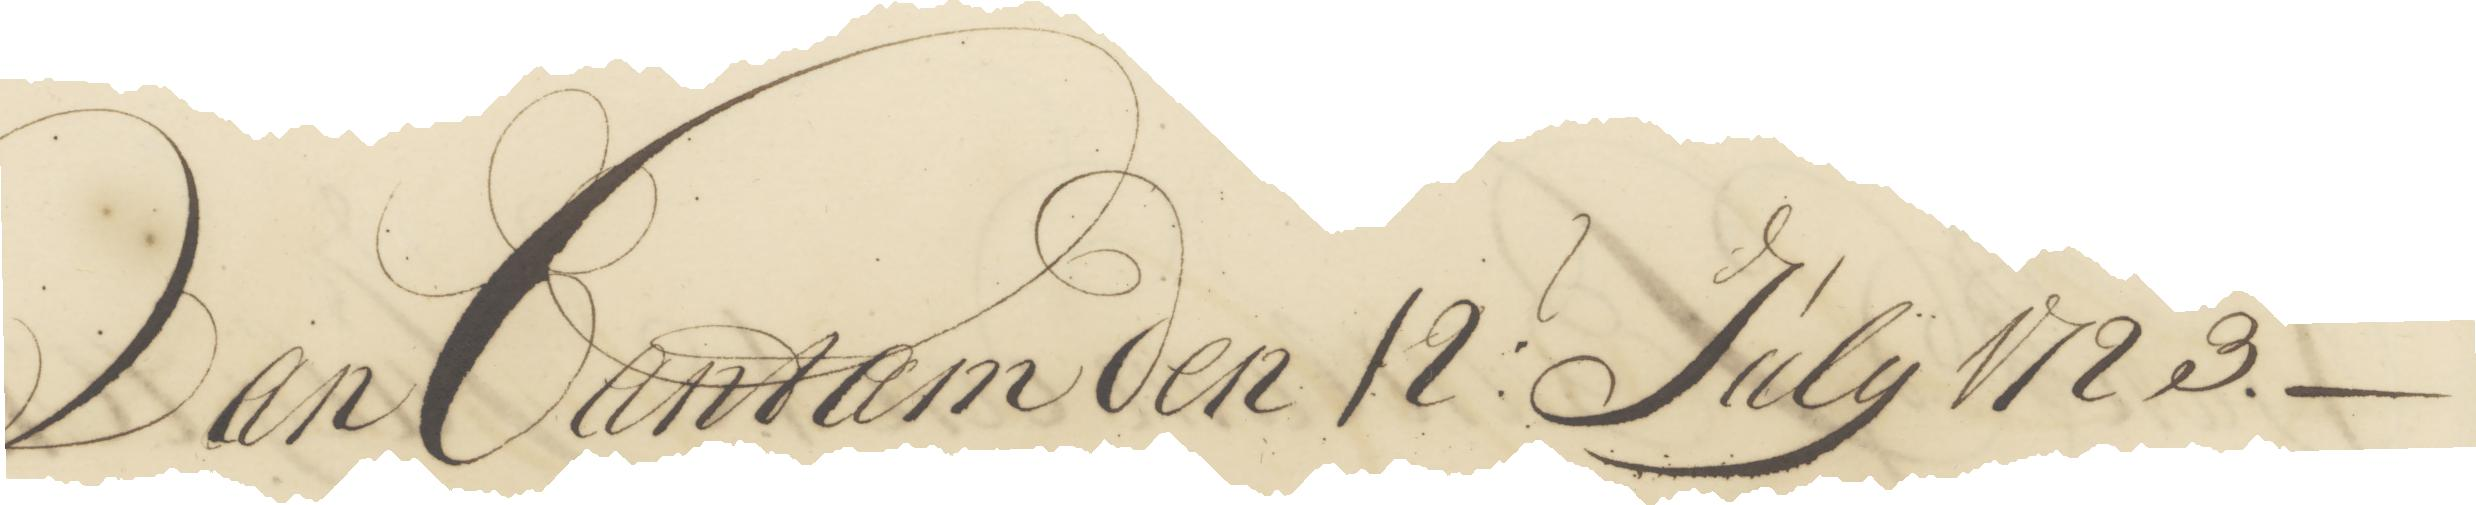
Van Bantam den 12:' Julij 1723. —
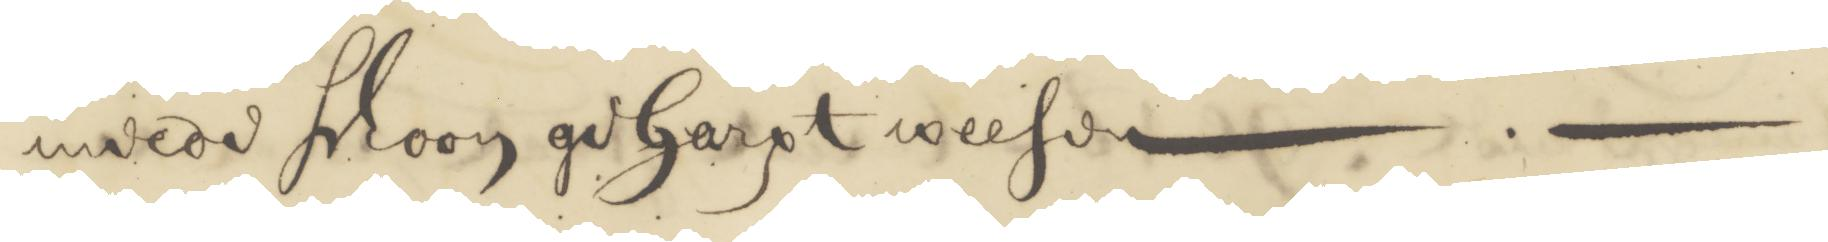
meede schoon geharpt weesen. —
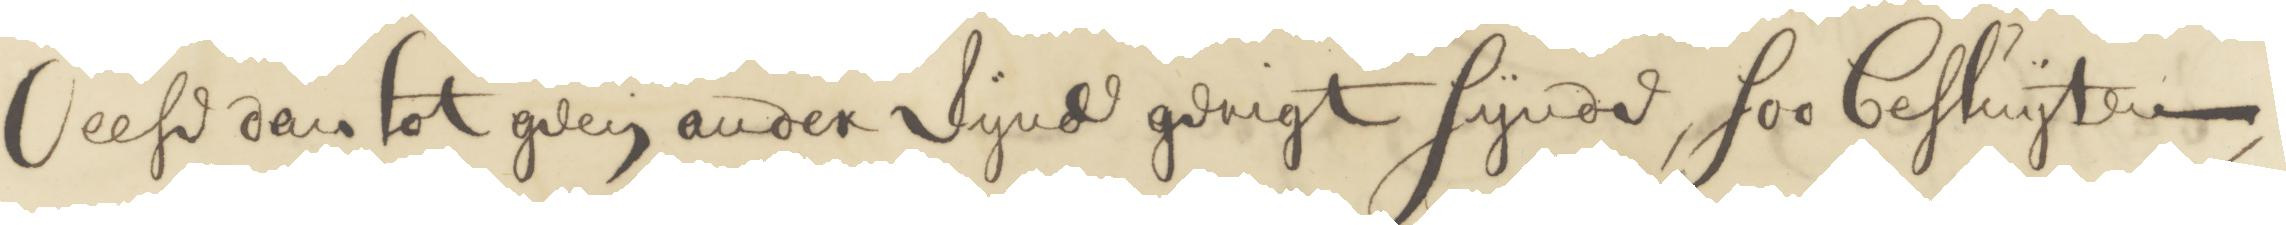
deese dan tot geen ander Eijnde gerigt sijnde, soo besluijten,
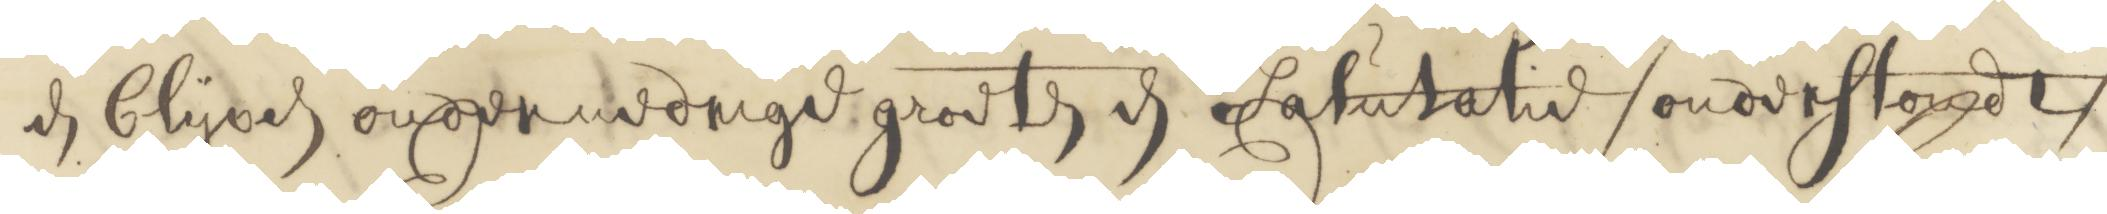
en blijven ondernedrige groeten en salutatie /onderstondt/
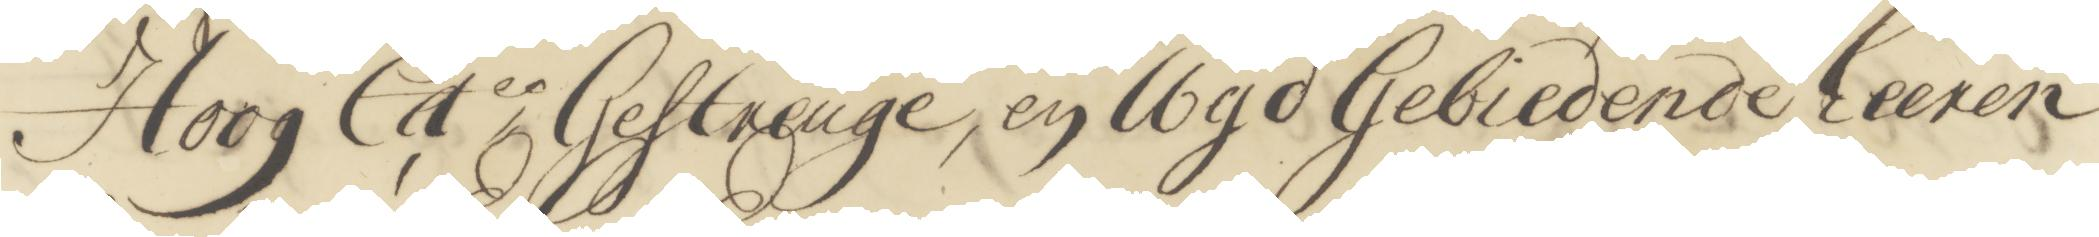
Hoog Ed„es Gestrenge, en wijd Gebiedende heeren
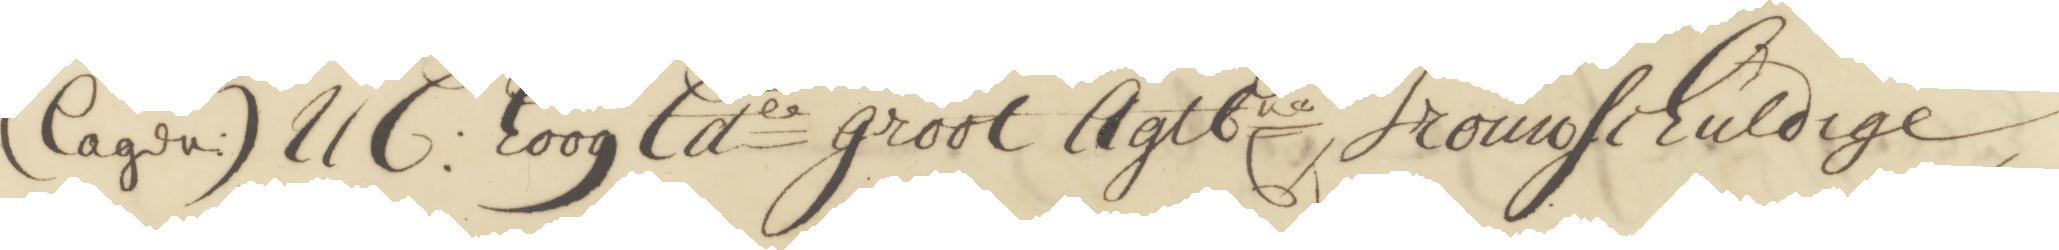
(lager:) UE: hoog Ed=le groot Agtb=re, Trouwschuldige,
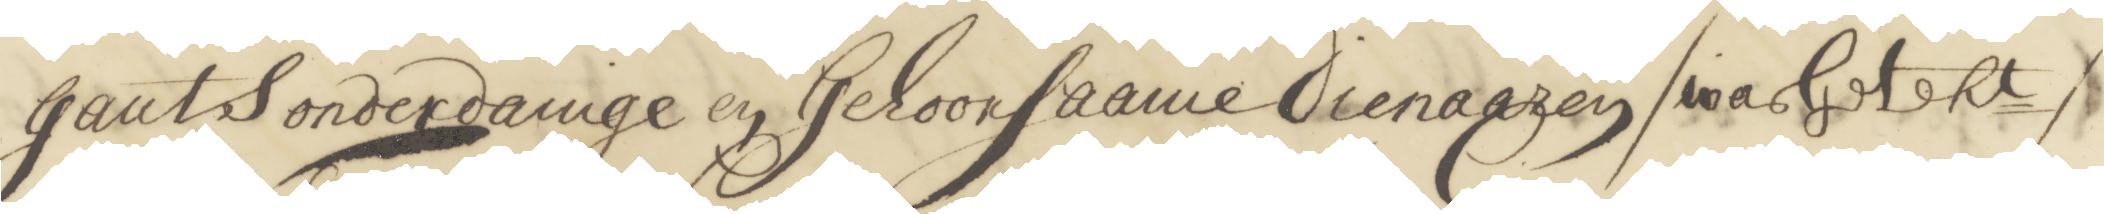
gants onderdanige en Gehoorsaame dienaaren /was Getek=t/
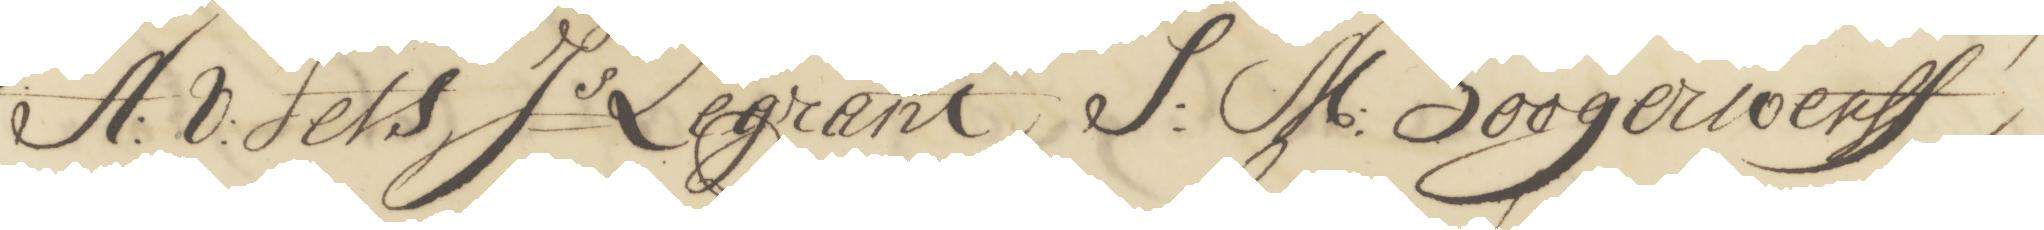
A: v: Fets, J=s Legrant, S: M: Hoogerwerff,
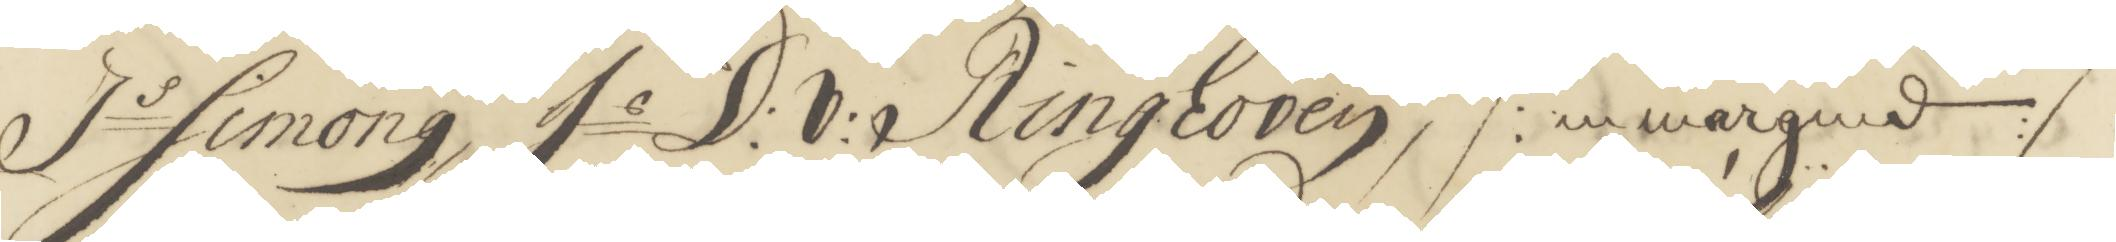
J=s simong, J=c D: v: Ringhoven, /:in margine:/
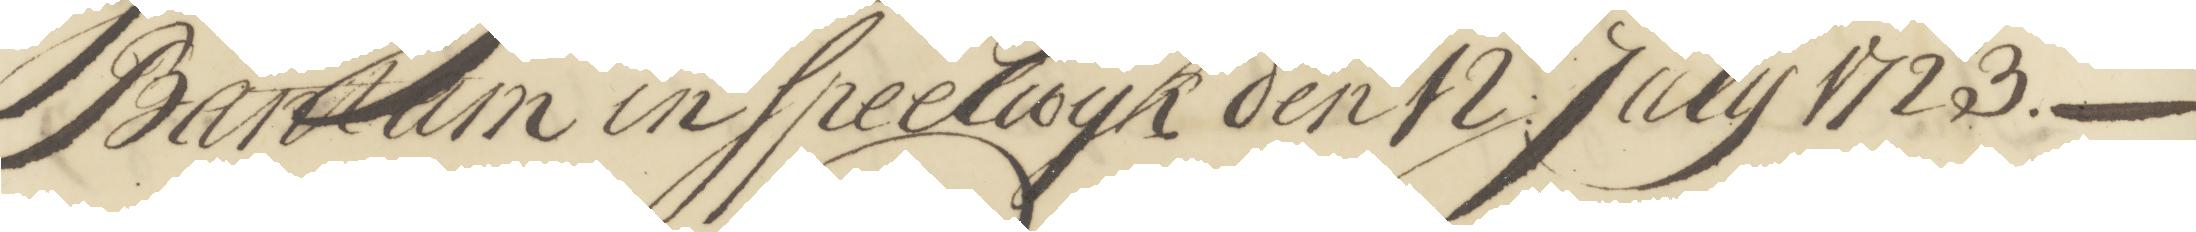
Bantam in speelwijk den 12:' Julij 1723. —
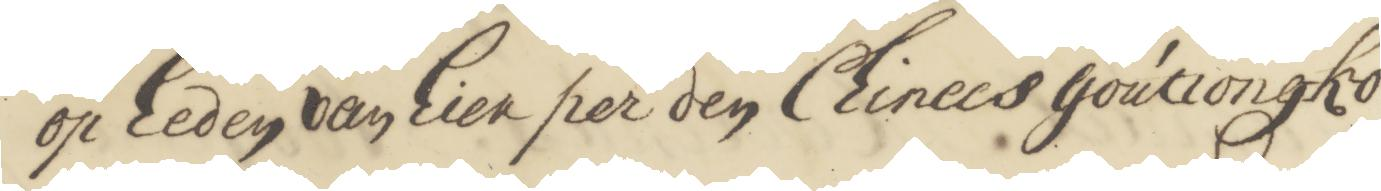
op heden van hier per den Chinees goutiongko
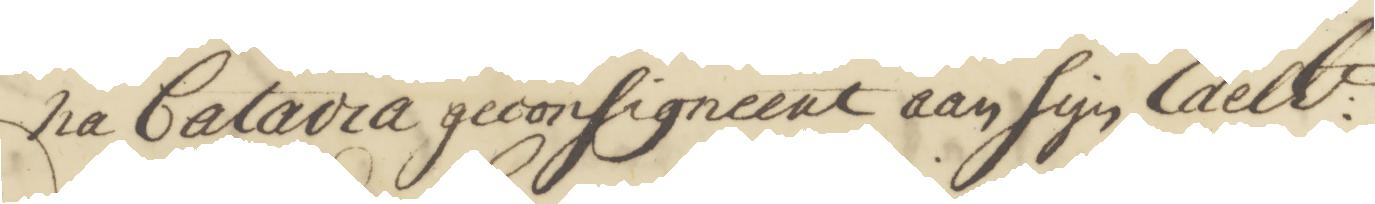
na Batavia geconsigneert aan sijn Edelh:t
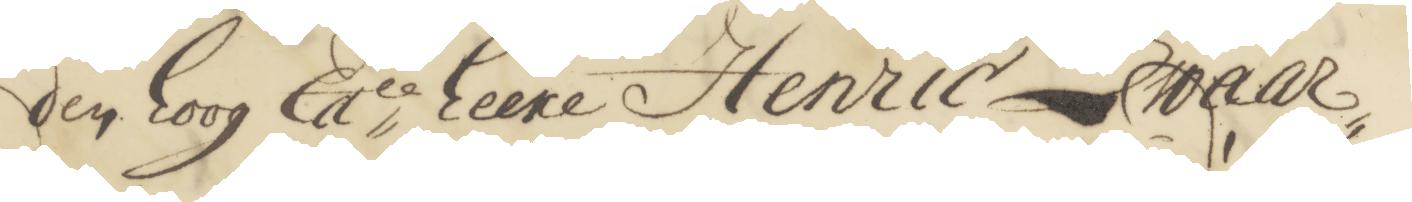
den hoog Ed„le heere Henric waar„
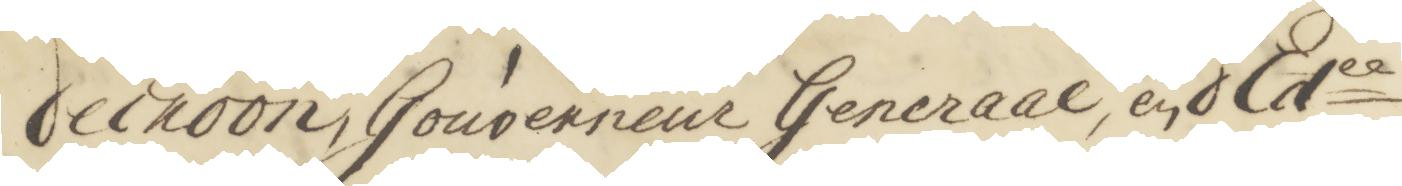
decroon, Gouverneur Generaal, en d’Ed=le
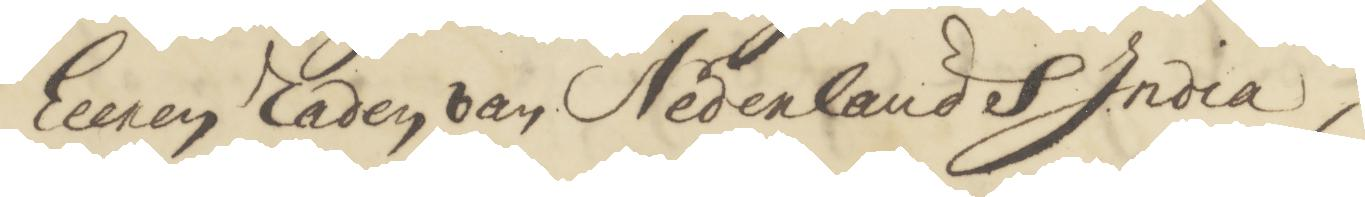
heeren raden van Nederlands Jndia,
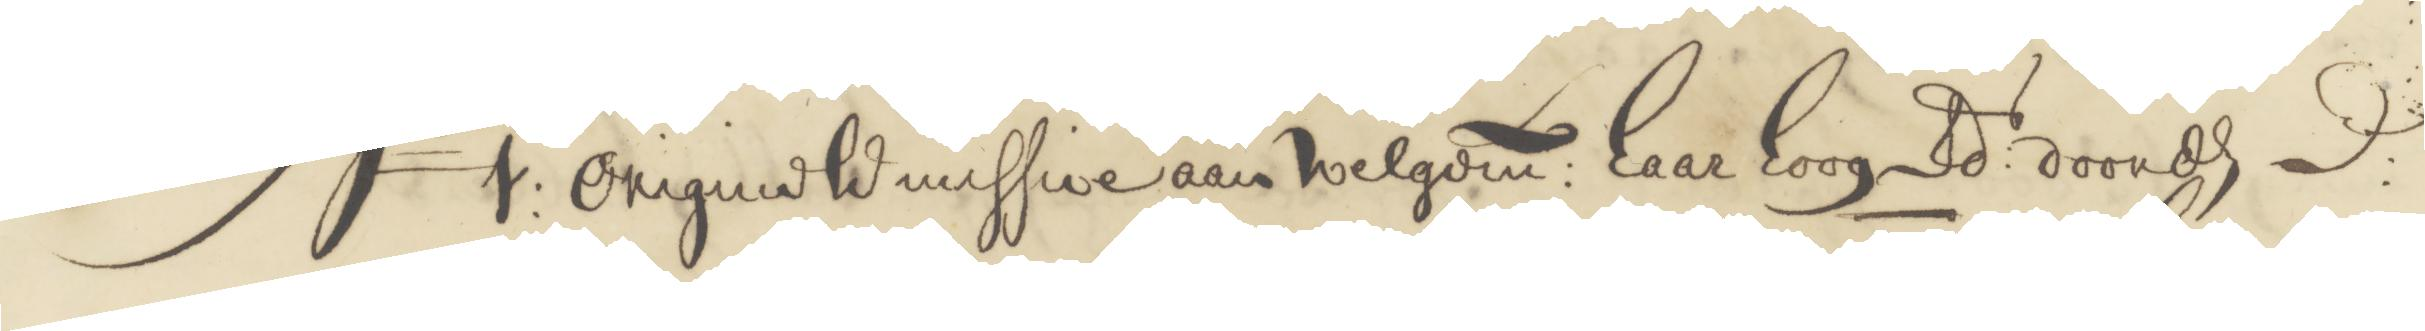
N=o 1: Originele missive aan welgem: haar hoog Ed:s door den E:
